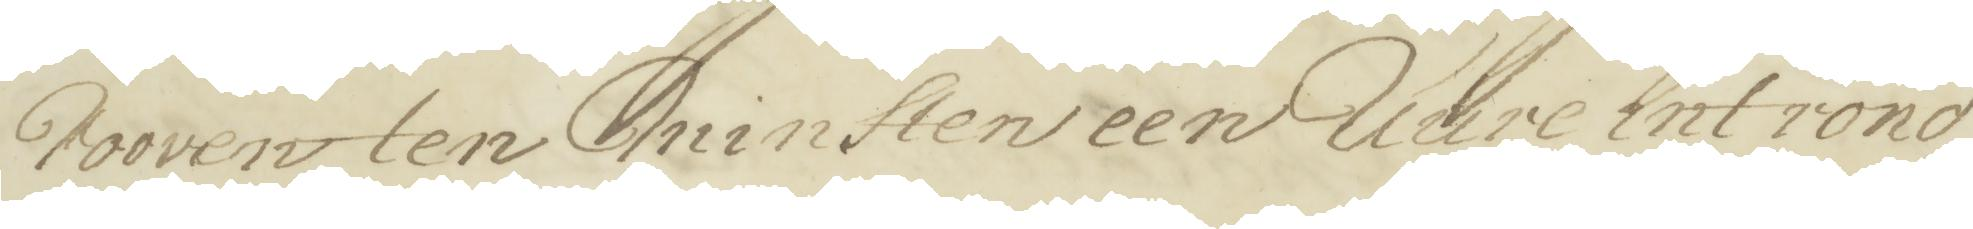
rooven ten minsten een uure int rond
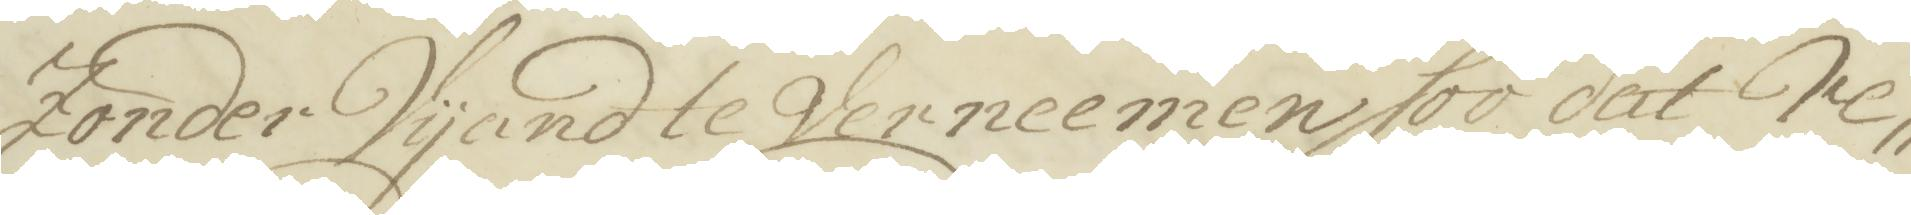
zonder vijand te verneemen soo dat re
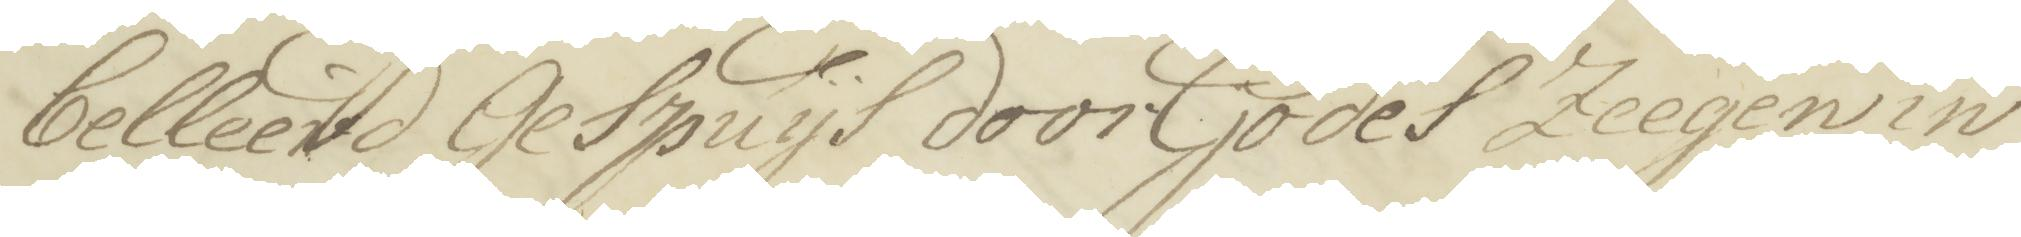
belleerd gespuijs door Godes zeegen in
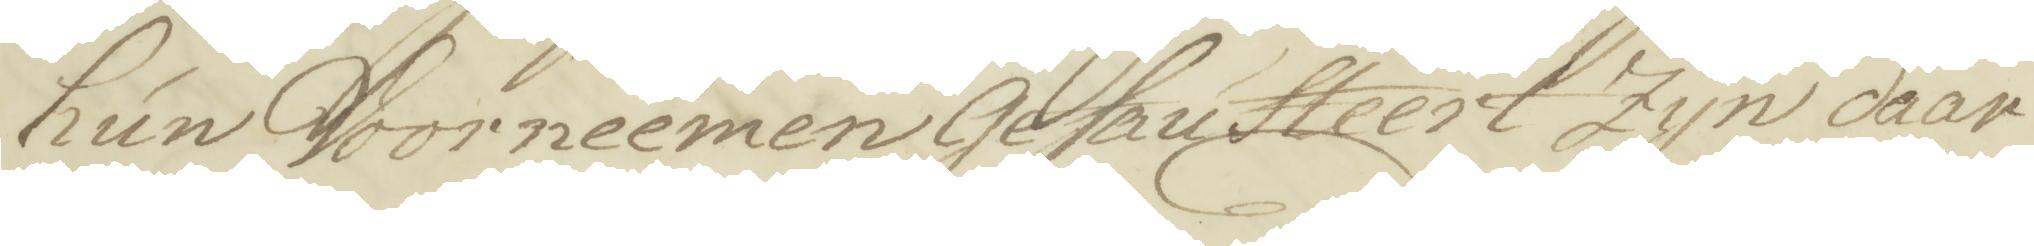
hun voorneemen gefausteert zijn daar
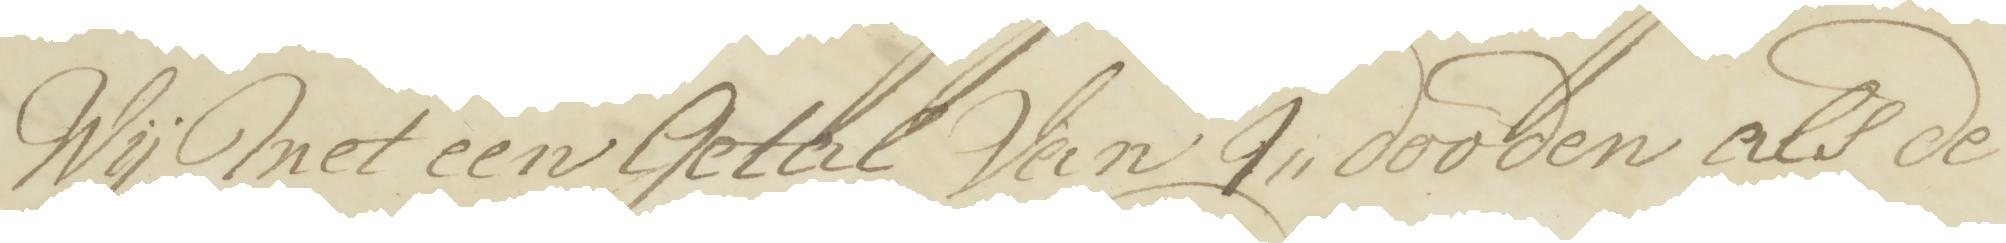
wij met een getal van 4„ dooden als de
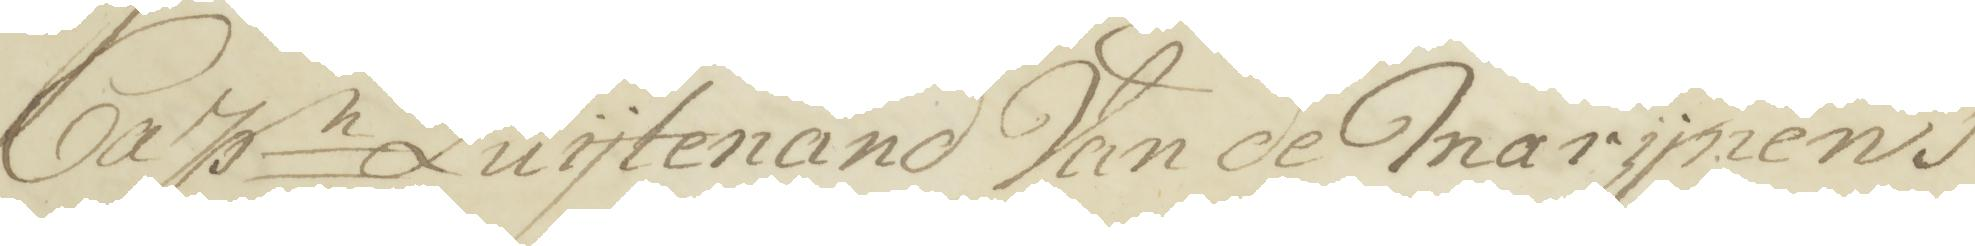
Cap=n Luijtenand van de marijnens
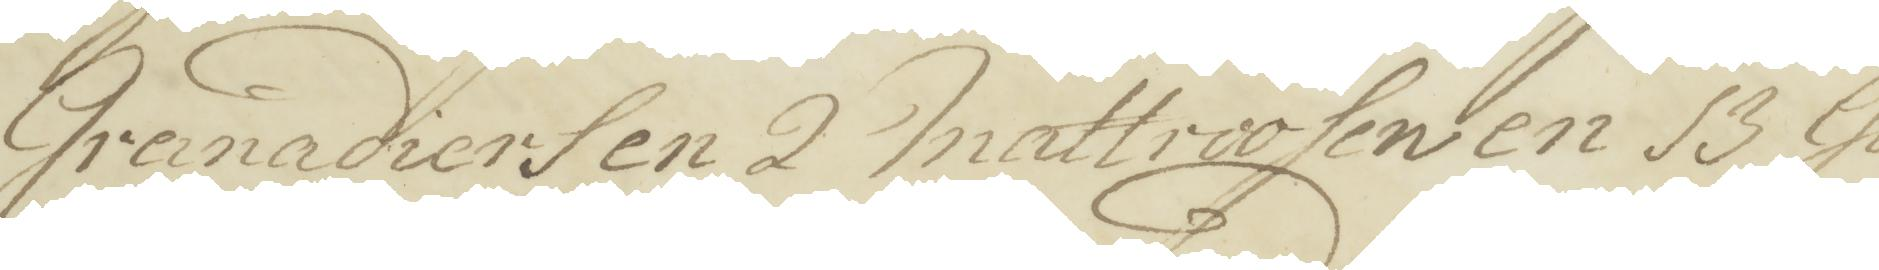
granadiers en 2 mattroosen en 13 Ge
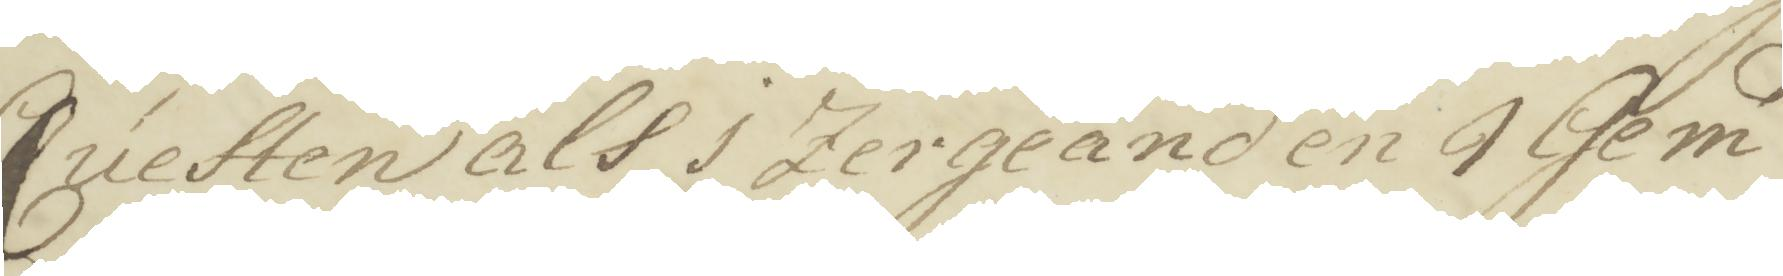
questen als 1 zergeand en 4 Gem
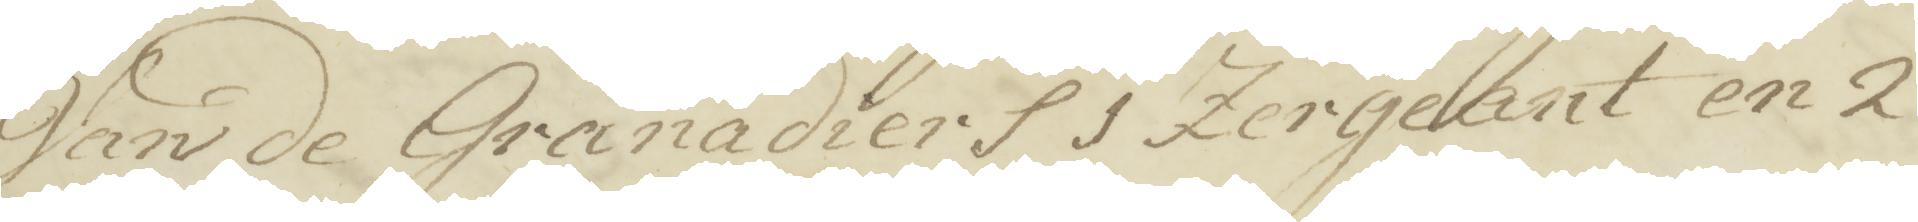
van de granadiers 1 zergeant en 2
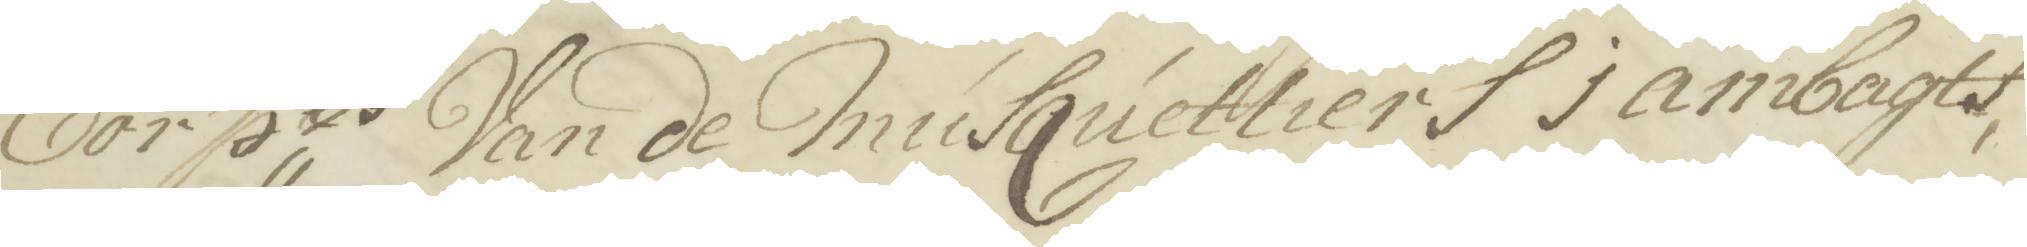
Corp„ls van de musquettiers 1 ambagts,
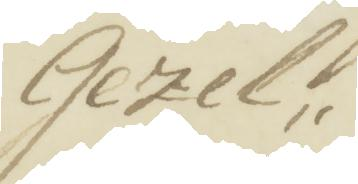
gezel„
